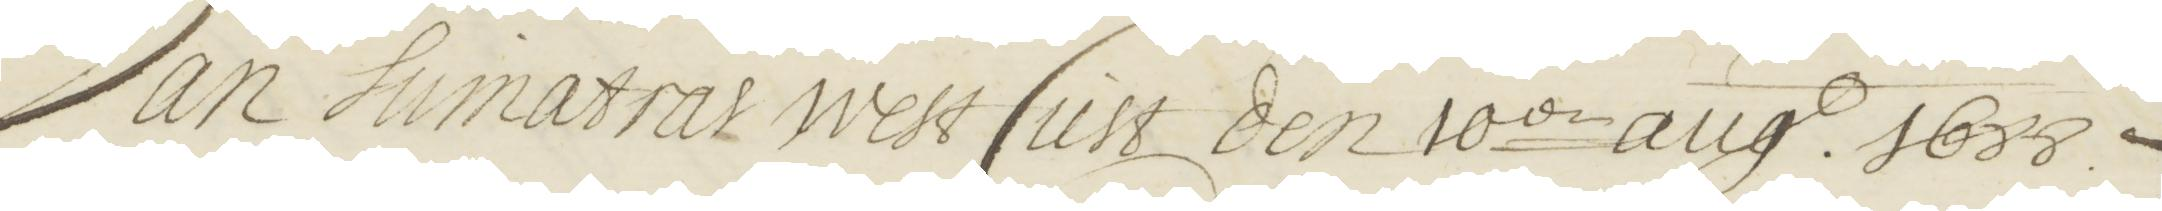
Van Sumatras West Cust den 10=en aug 1688.
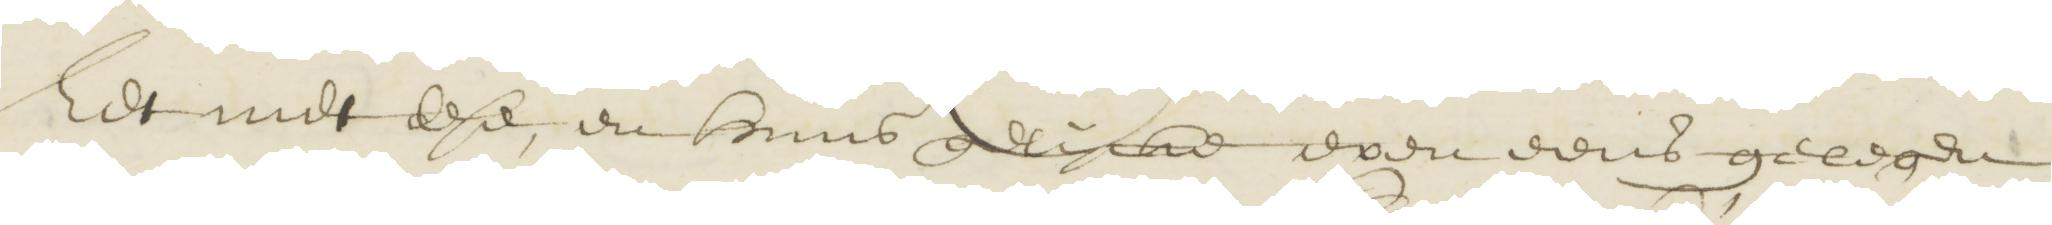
het met dese, en huns gelijcke even eens gelegen
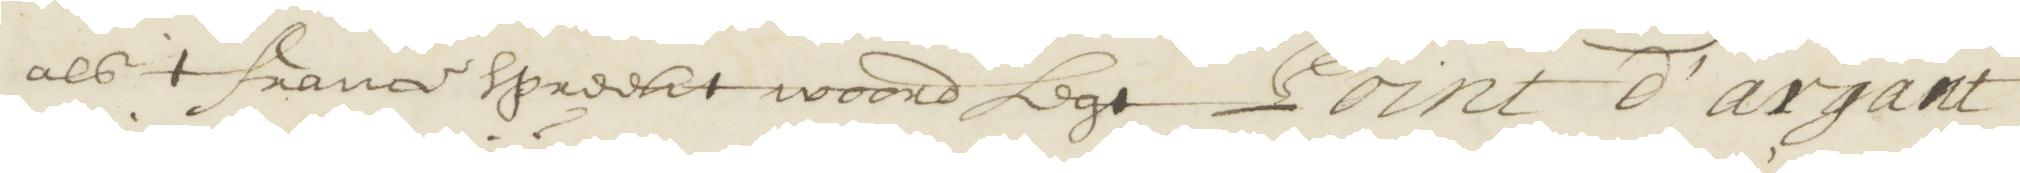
als ’t France spreekt woord Segt Point d’ argant
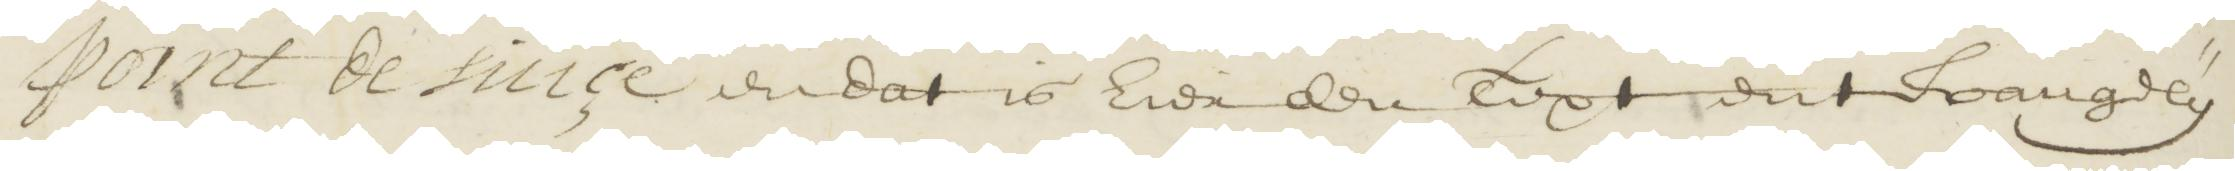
Point de Suiçe en dat is hier den text en’t Vervangelijk
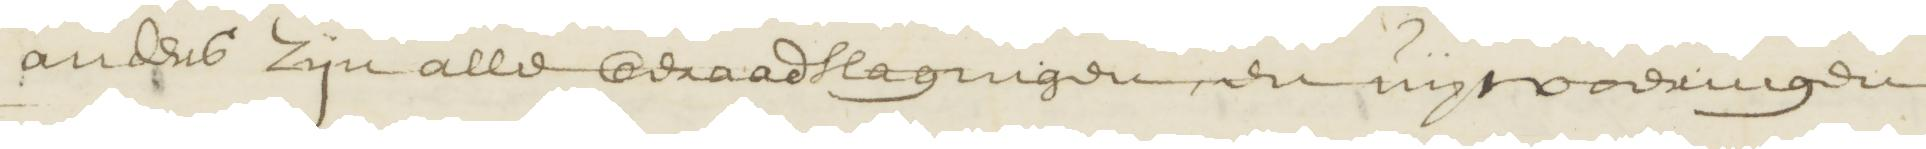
anders zijn alle beraadslagingen, en uijtvoeringen
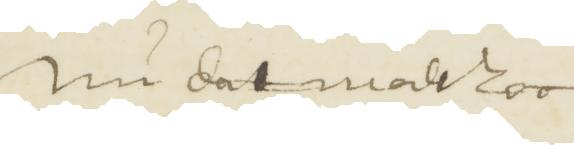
nu dat moet Zoo
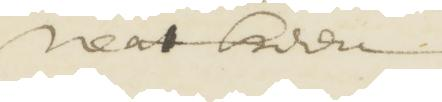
wat heen
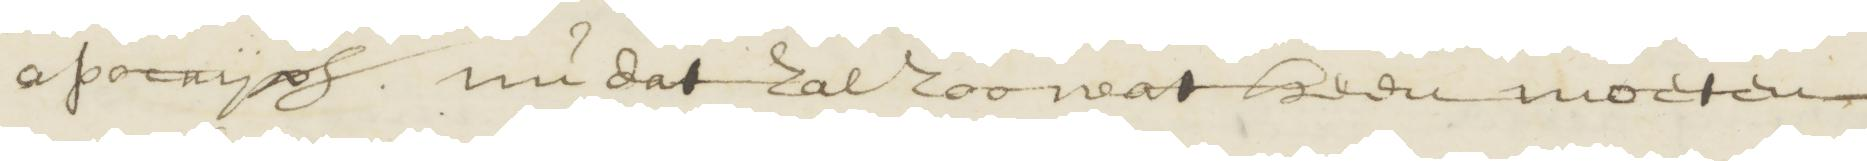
apocrijph. nu dat zal zoo wat heen moeten
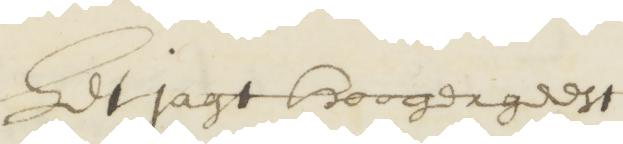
het jagt Hoogergeest
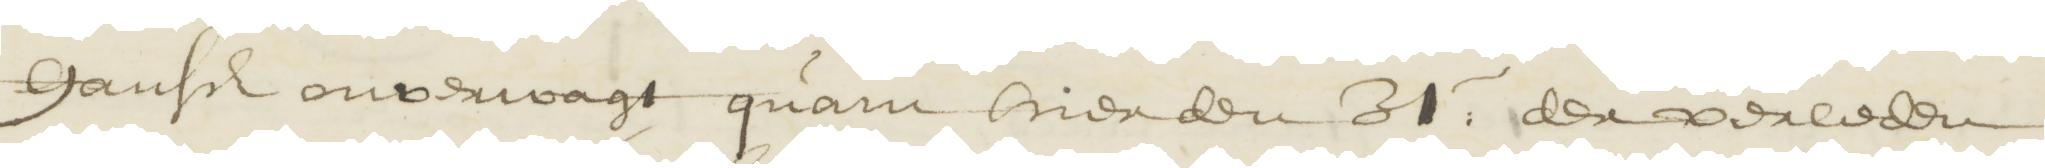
gansch onverwagt quam hier den 31: der verleden
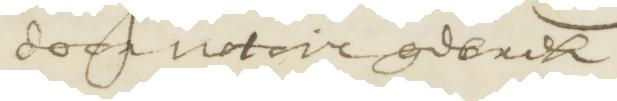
door notoir gebrek
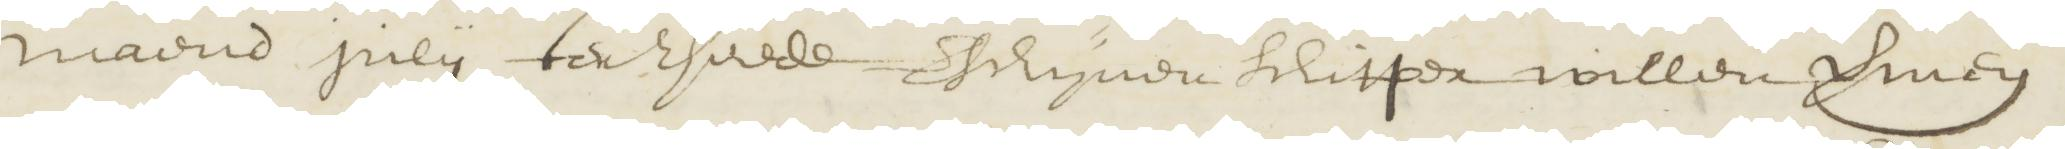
maend Julij ter rheede verschijnen schipper willem Vermeij
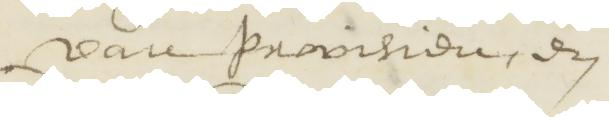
van provisien, en
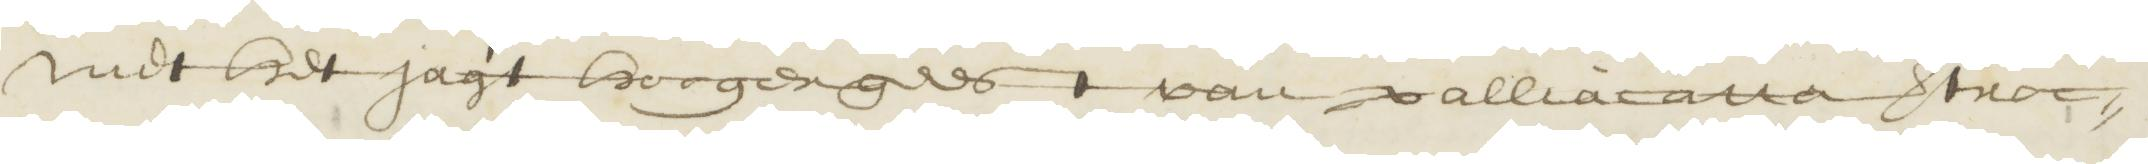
met het jagt hoogergeest van palliacatta vertroc„
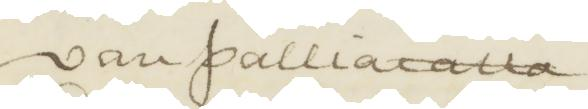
van Palliacatta
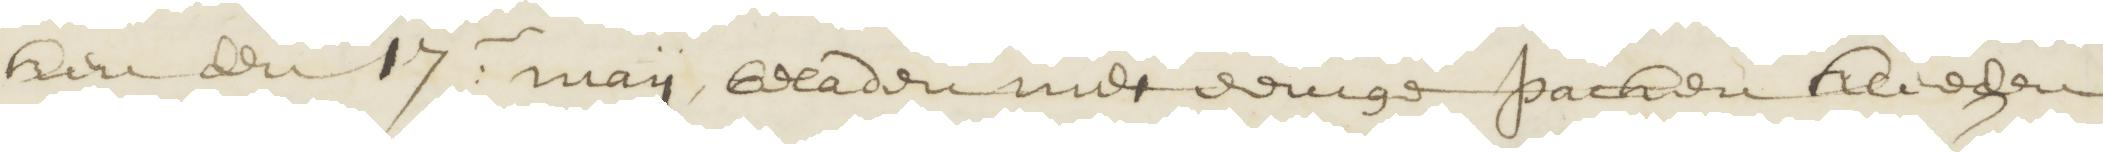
ken den 17:' maij, beladen met eenige packen kleeden
